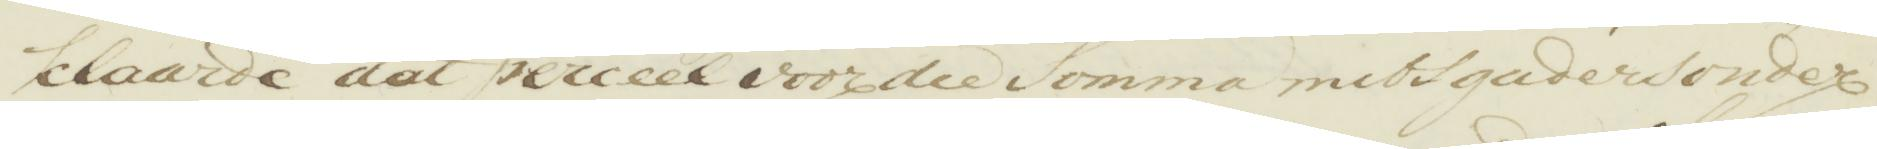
klaarde dat perceel voor die somma mitsgaders onder
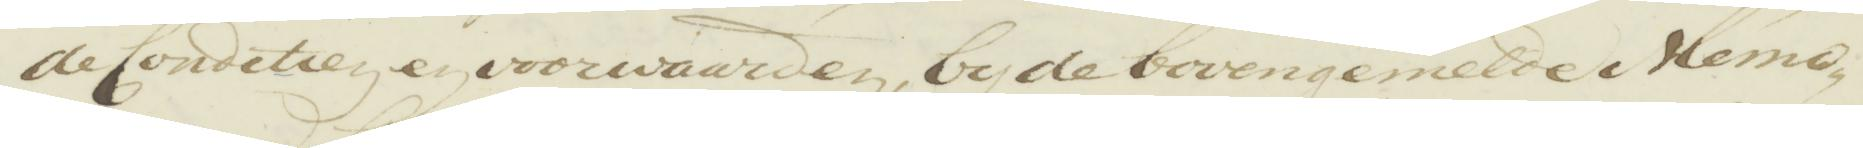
de Conditien en voorwaarden, by de bovengemelde Memo„
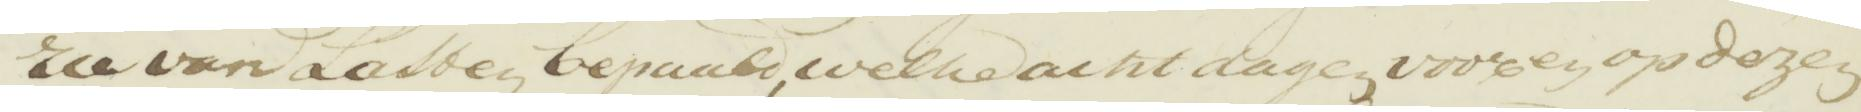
rie van Lasten bepaald, welke acht dagen voor en op dezen
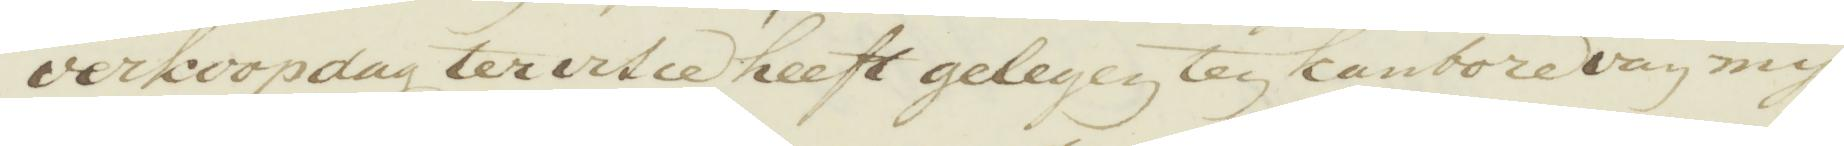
verkoopdag ter vitie heeft gelegen ten kantore van my
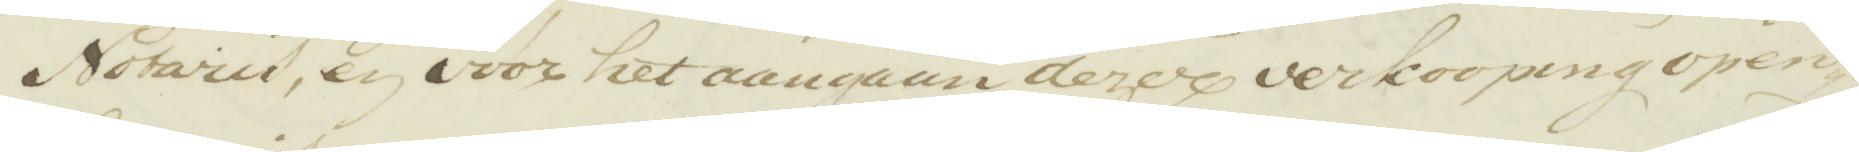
Notaris, en voor het aangaan dezer verkooping open
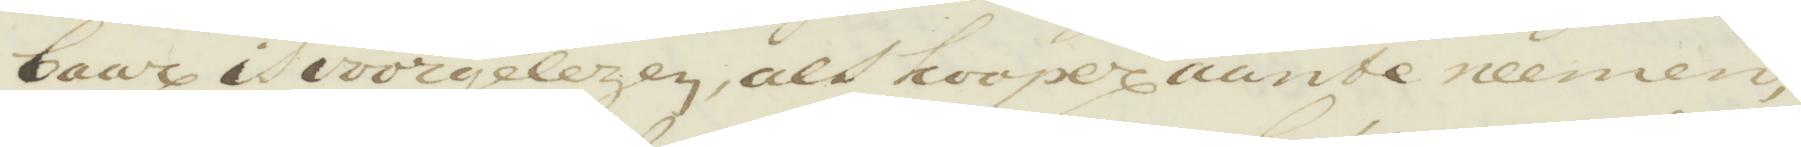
baar is voorgelezen, als kooper aante neemen,
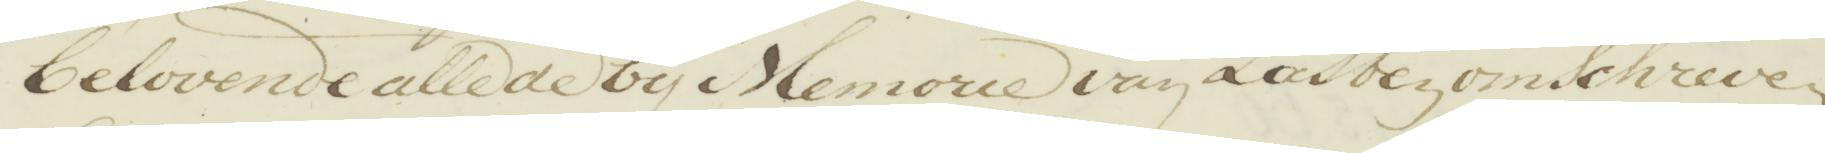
belovende alle de by Memorie van Lasten omschreven
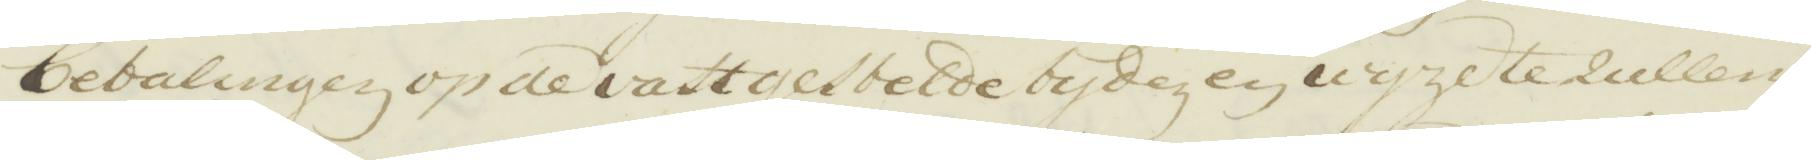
betalingen op de vastgestelde tyden en wijze te zullen
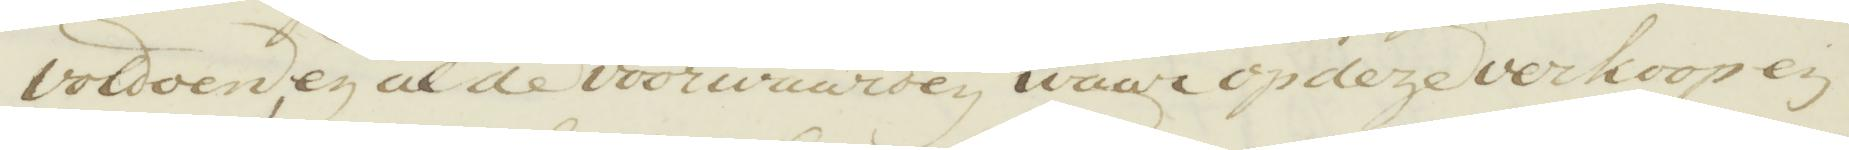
voldoen en al de voorwaarden waar op deze verkoop en
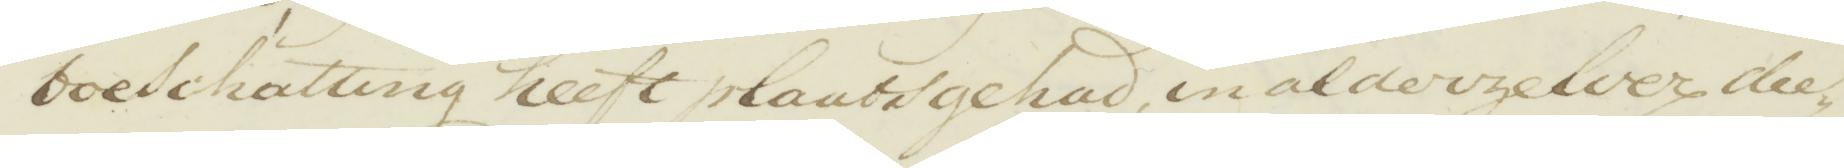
toeschatting heeft plaatsgehad, in alderzelver dee„
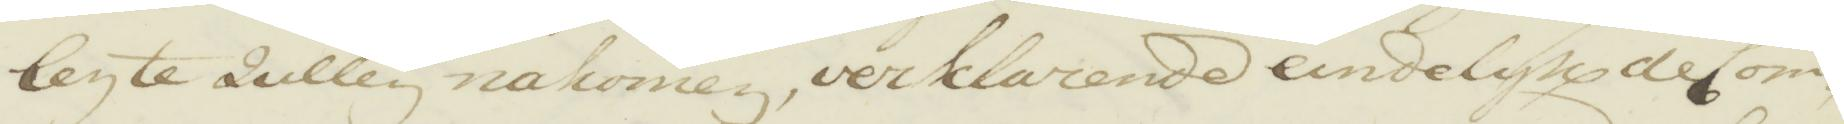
len te zullen nakomen, verklarende eindelyk de Com
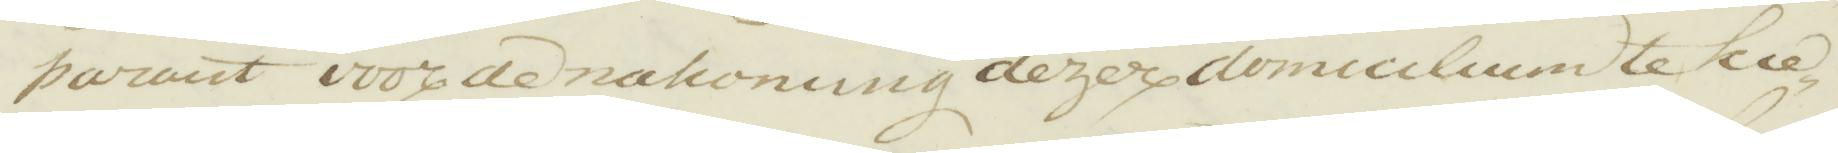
parant voor de nakoming dezer domicilium te kie„
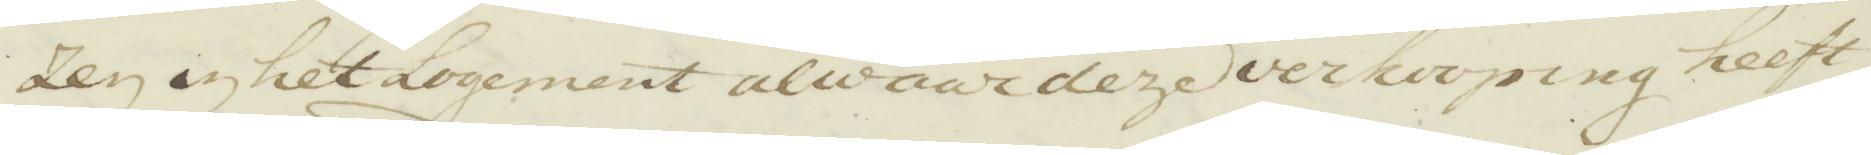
zen in het Logement alwaar deze verkooping heeft
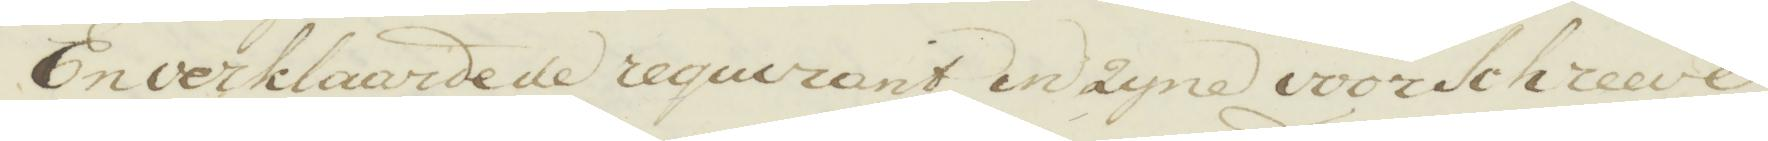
En verklaarde de requirant in zyne voorschreeve
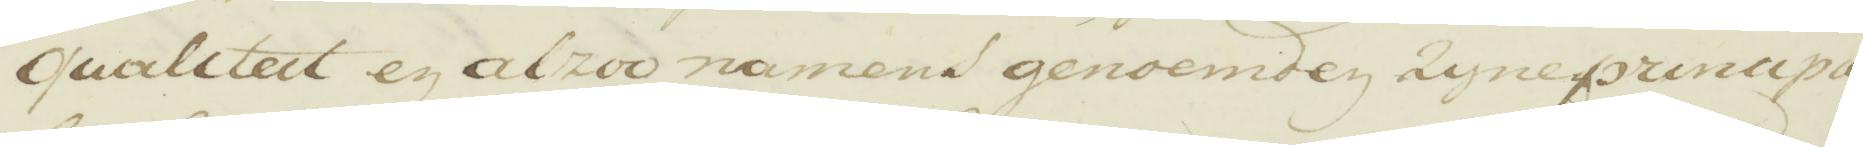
qualiteit en alzoo namens genoemden zyne principa
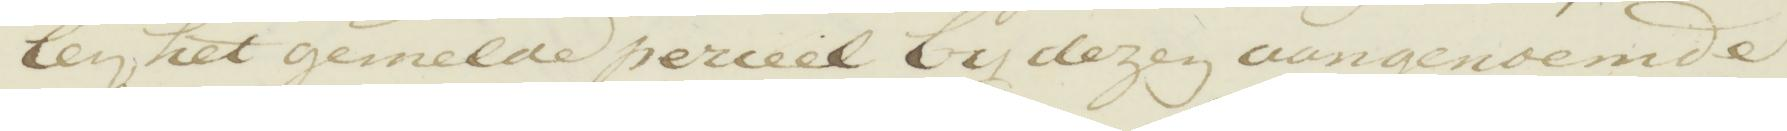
len het gemelde perceel bij dezen aangenoemde
